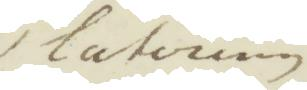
Platering
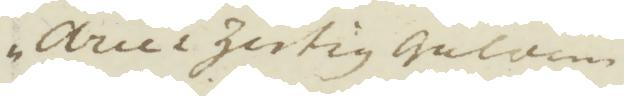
„drie en Zestig guldens
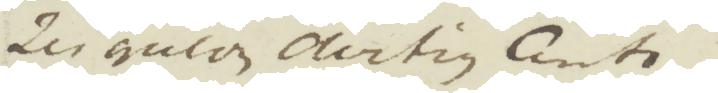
Zes gulden dertig Cents
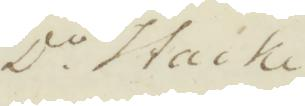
D.r Hacke
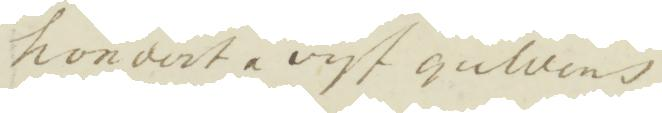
hondert en vyf guldens
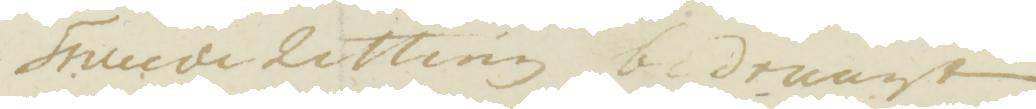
Tweede zitting bedraagt
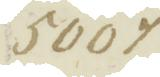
5007
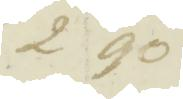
2 90
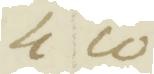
4 10
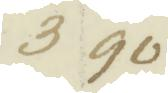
3 90
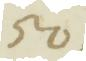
36 50
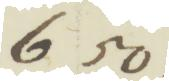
6 50
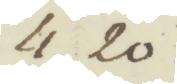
4 20
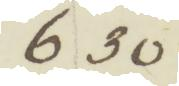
6 30
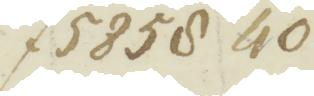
ƒ5858 40
